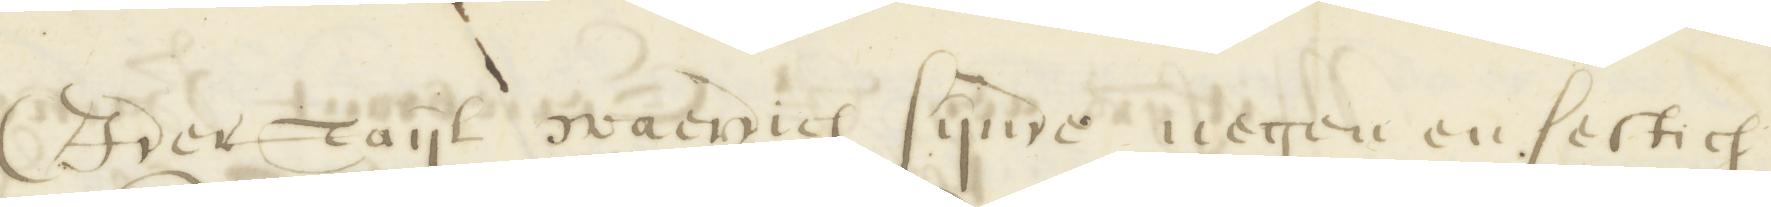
(Ider Taijl waerdich sijnde negen en sestich
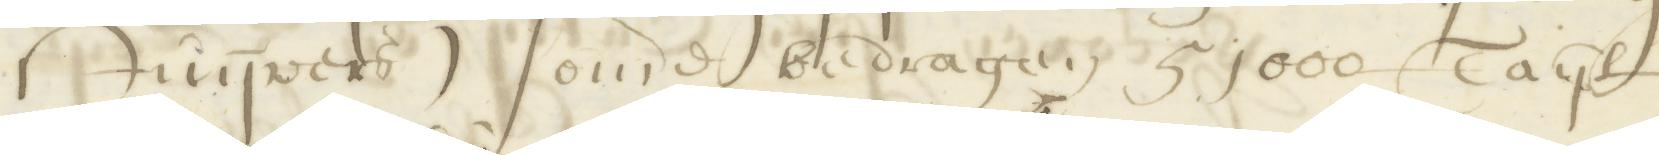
stuijvers) soude bedragen 51000 Taijl
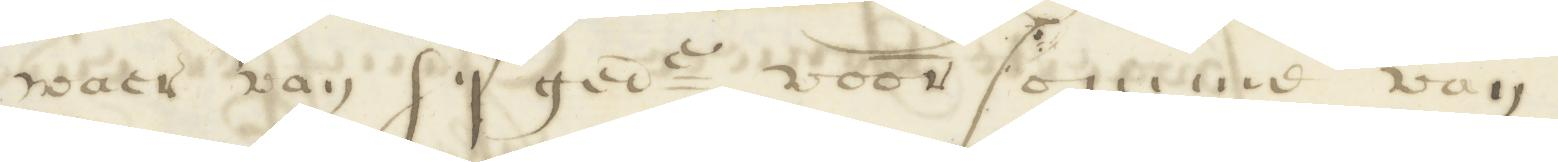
waer van hij ged=e voor somme van
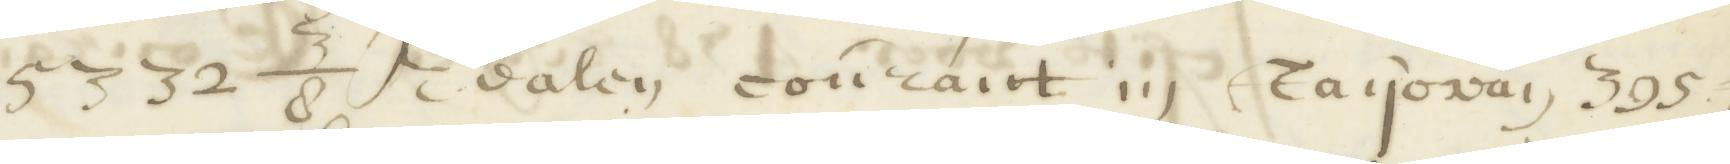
5332 3/8 Realen courant in Taijovan 395 3/8
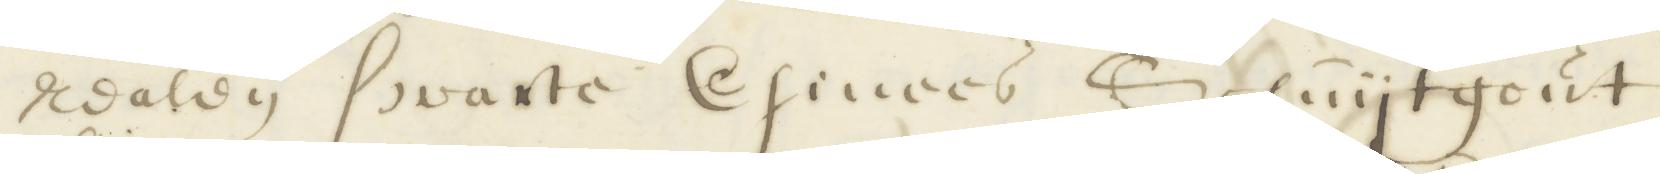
realen swarte Chinees Schuijtgout
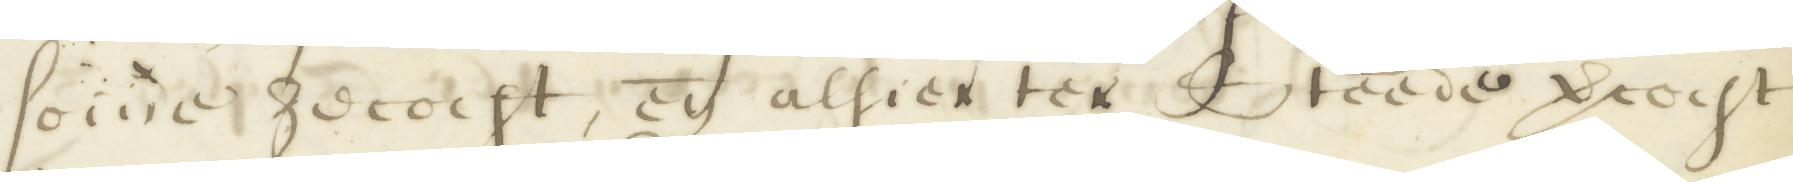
some gecocht, en alhier ter Steede vercocht
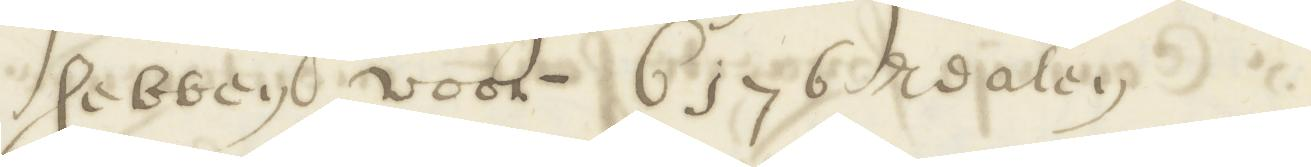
hebben voor 6176 realen
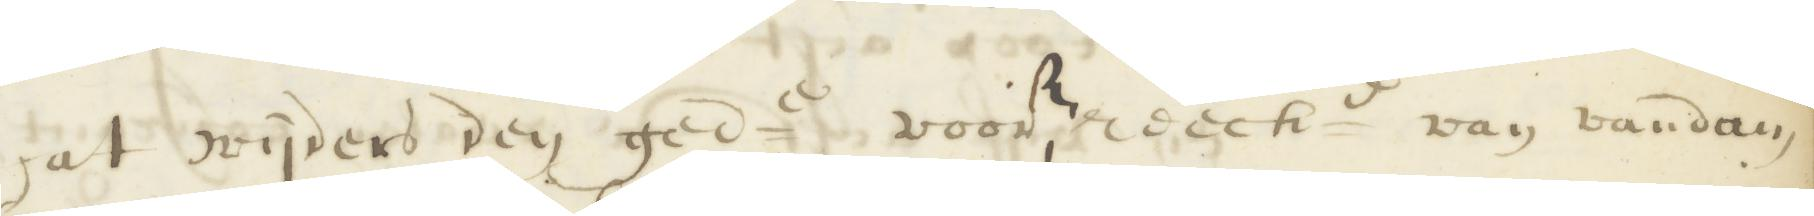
Dat wijders den ged=te voor reeck=e van van dam
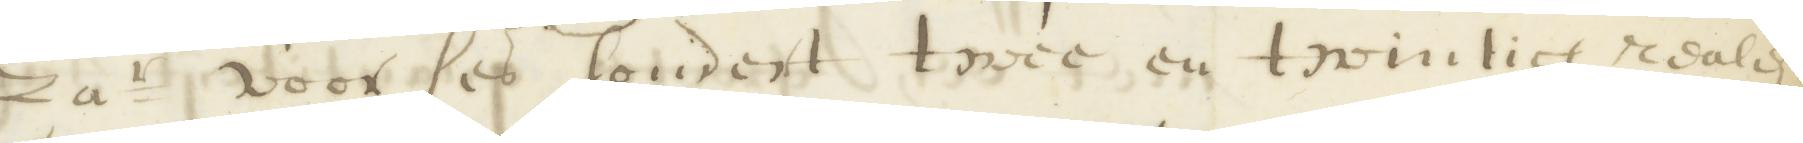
za=r voor ses hondert twee en twintich realen
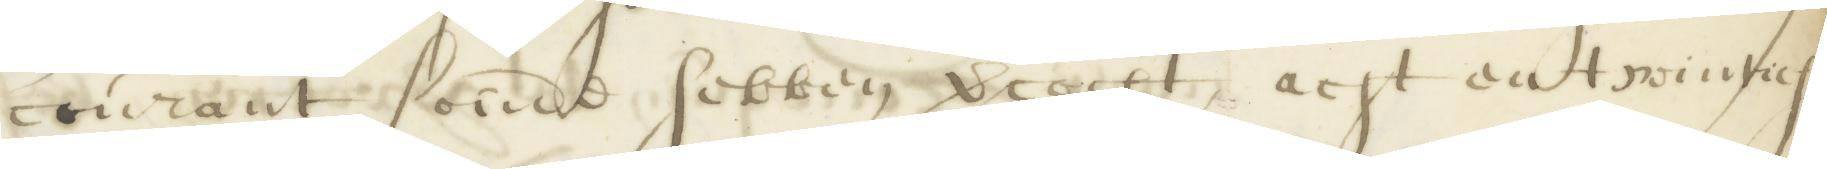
courant soude hebben vercocht, acht en twintich:
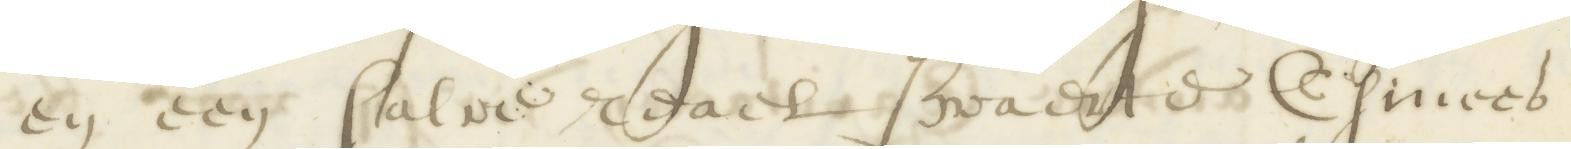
en een halve real swaerte Chinees
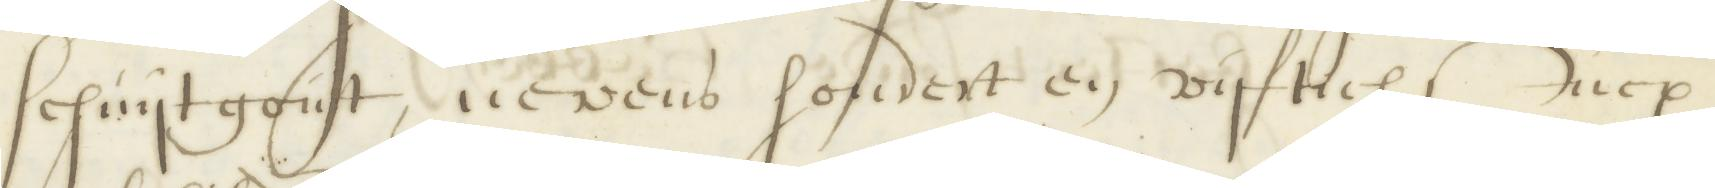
schuijtgout, nevens hondert en vijftich stucx
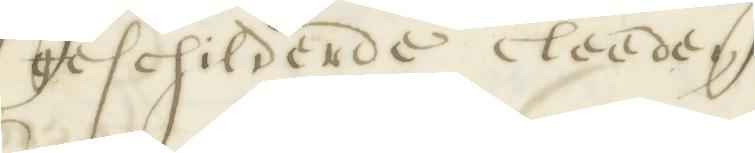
geschilderde cleedeij
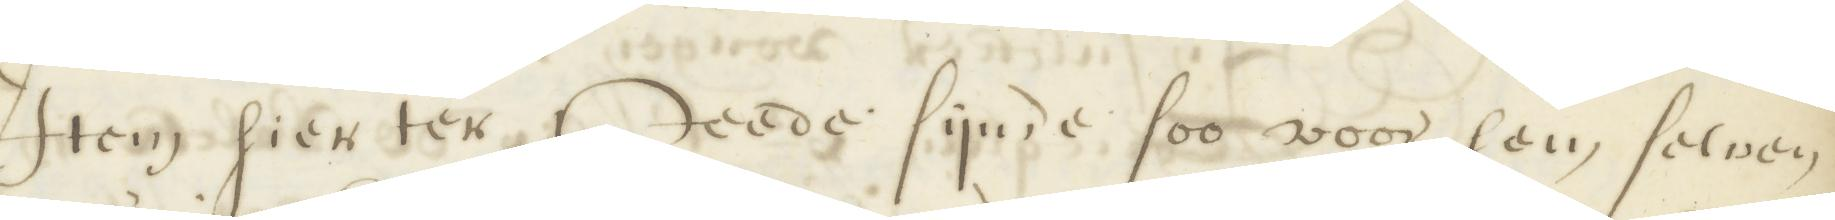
Jtem sier ter steede sijnde soo voor hem selven
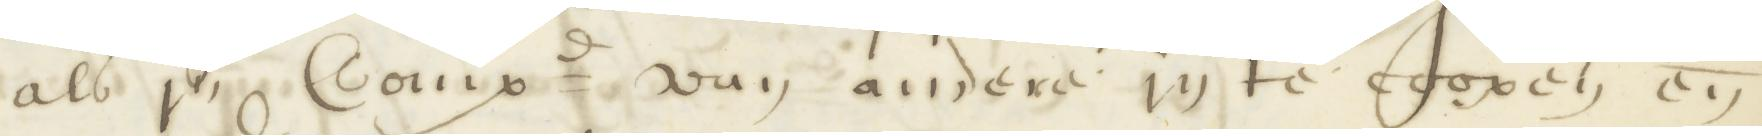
als jn Comp=e van andere jn te coopen en
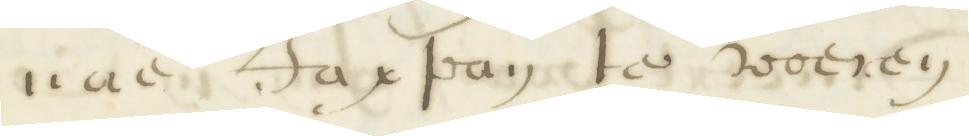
nae Iappan te voeren
